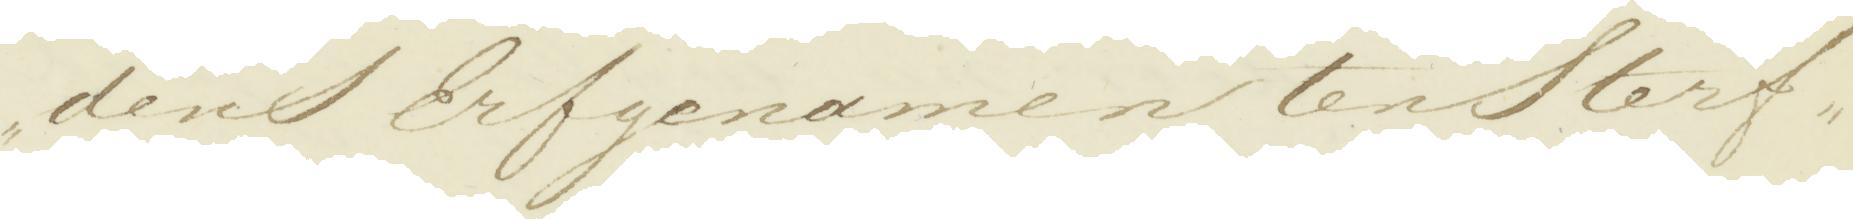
„dens Erfgenamen ten sterf„
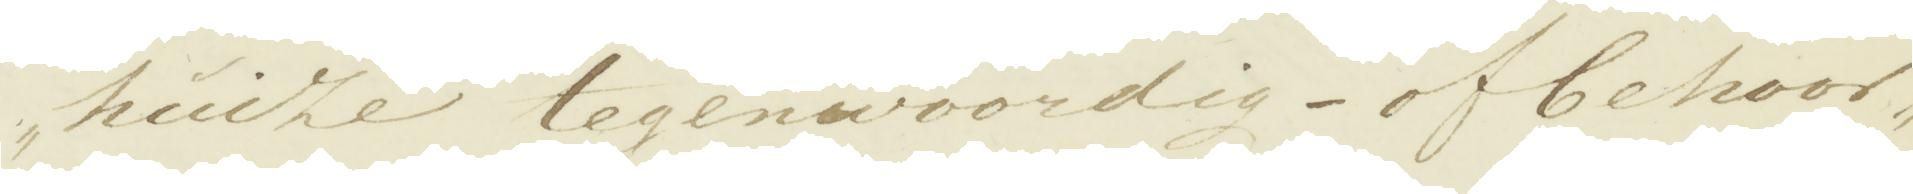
„huize tegenwoordig- of behoor
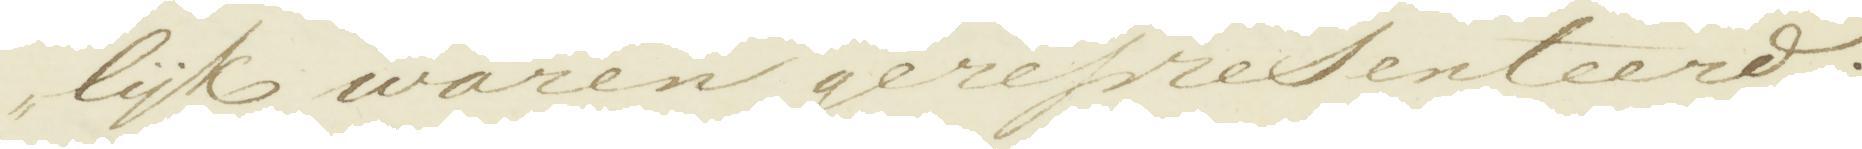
„lijk waren gerepresenteerd;
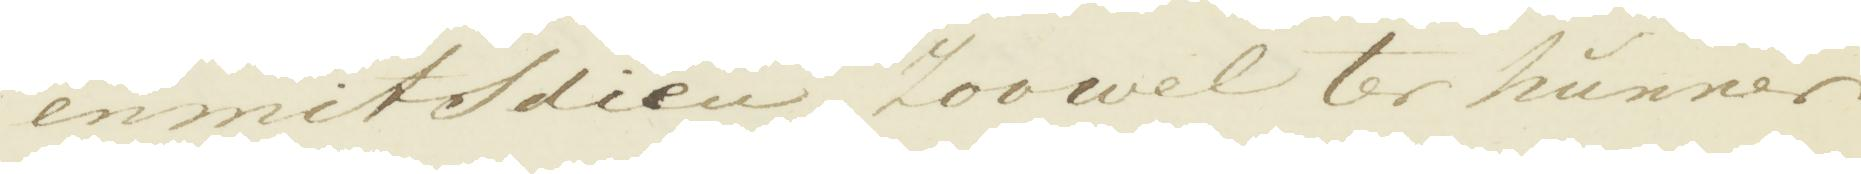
en mitsdien, zoowel ter hunner
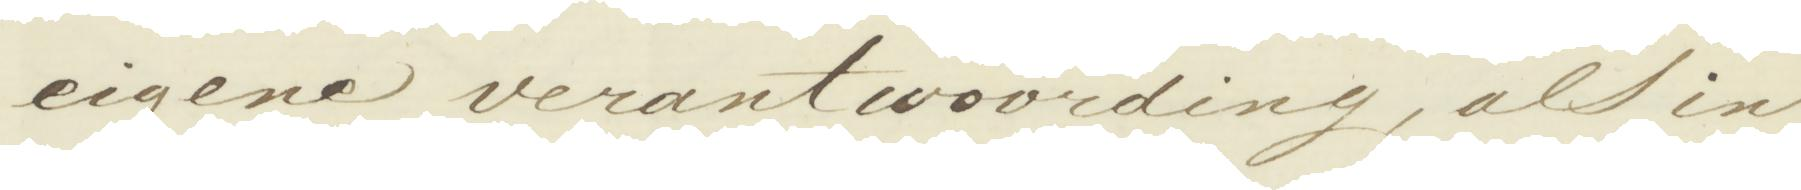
eigene verantwoording, als in
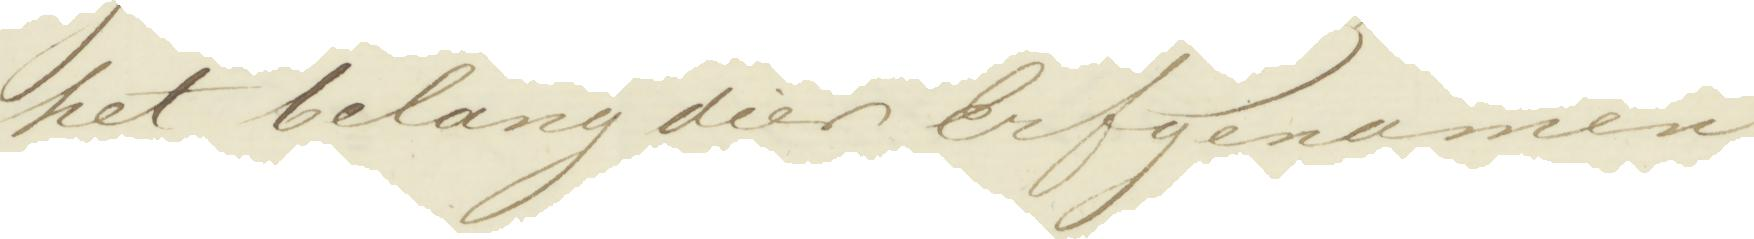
het belang dier Erfgenamen,
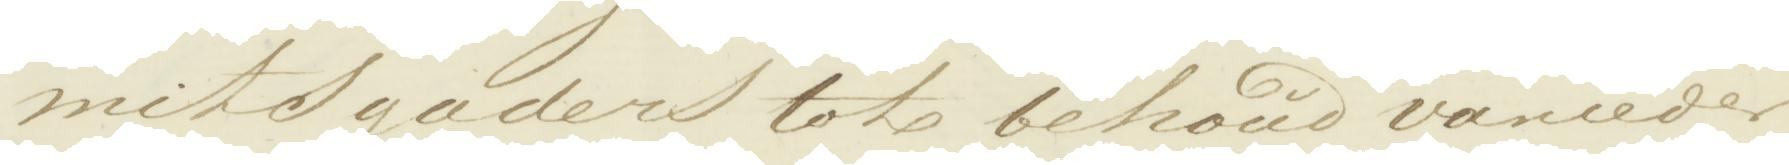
mitsgaders tot behoud vanieders
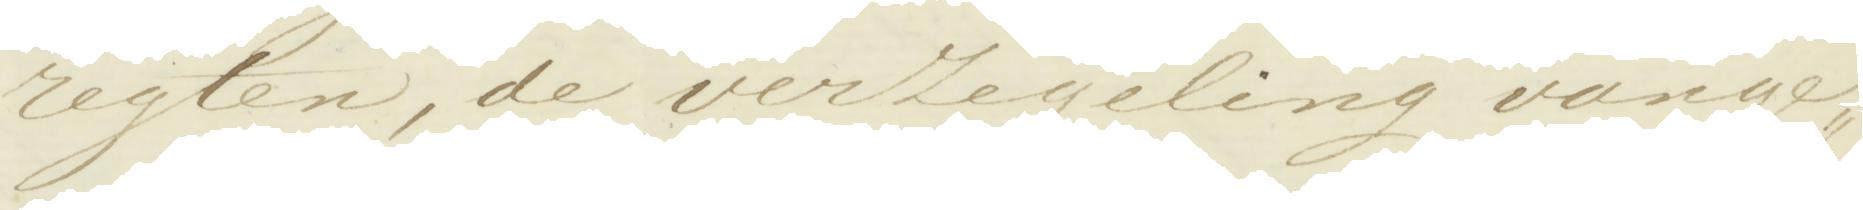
regten, de verzegeling vange„
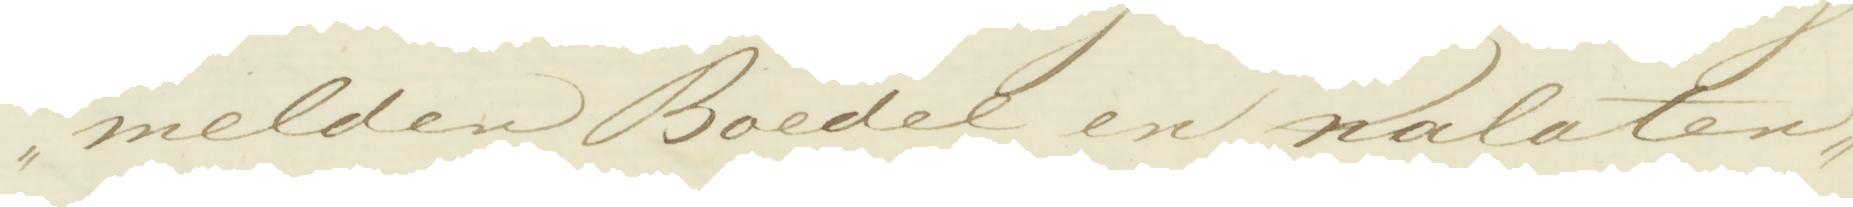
„melden Boedel en nalaten„
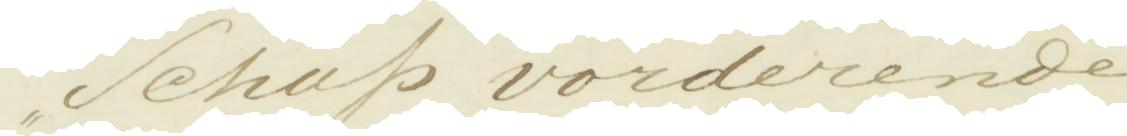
„schap vorderende
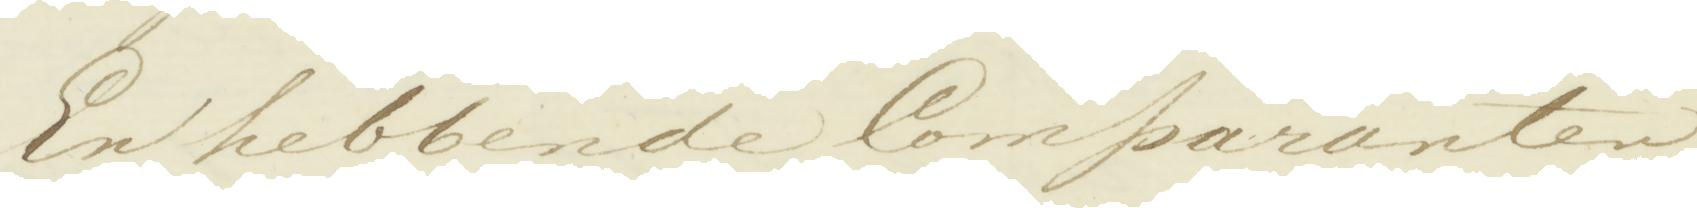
En hebbende Comparanten
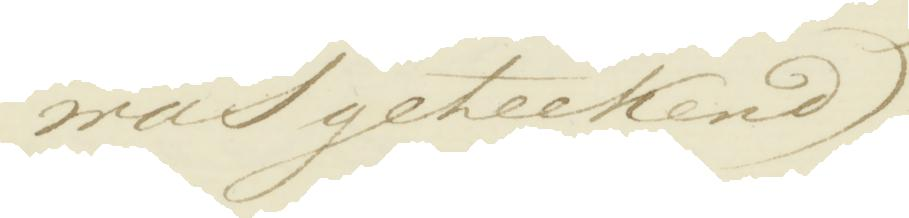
was geteekend)
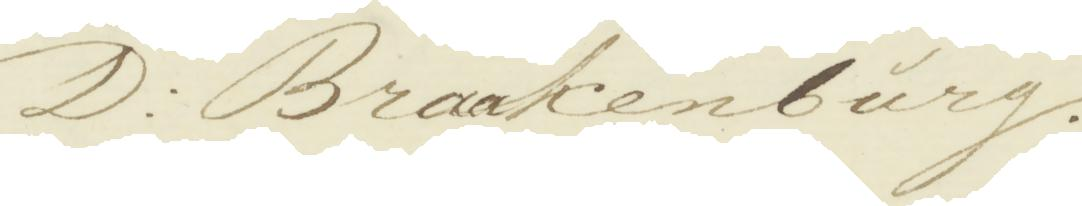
D: Braakenburg
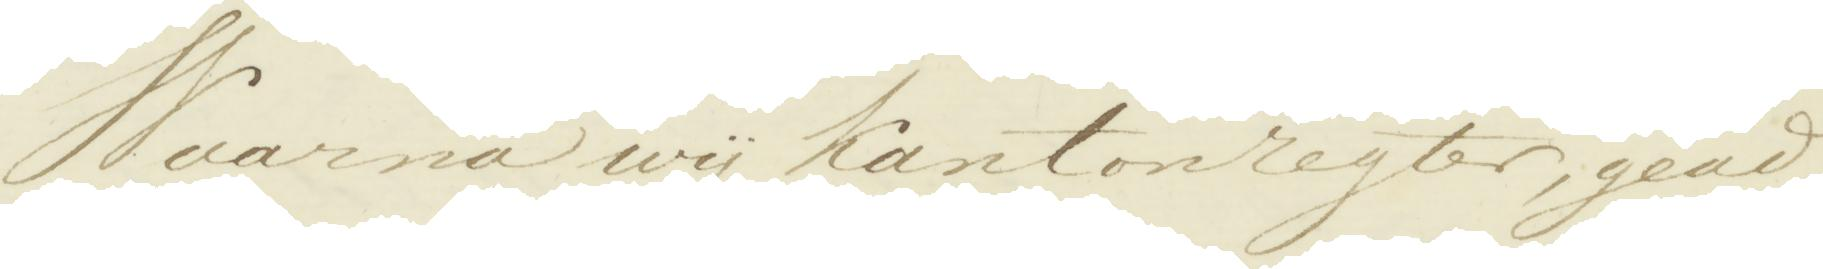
Waarna wij kantonregter, gead
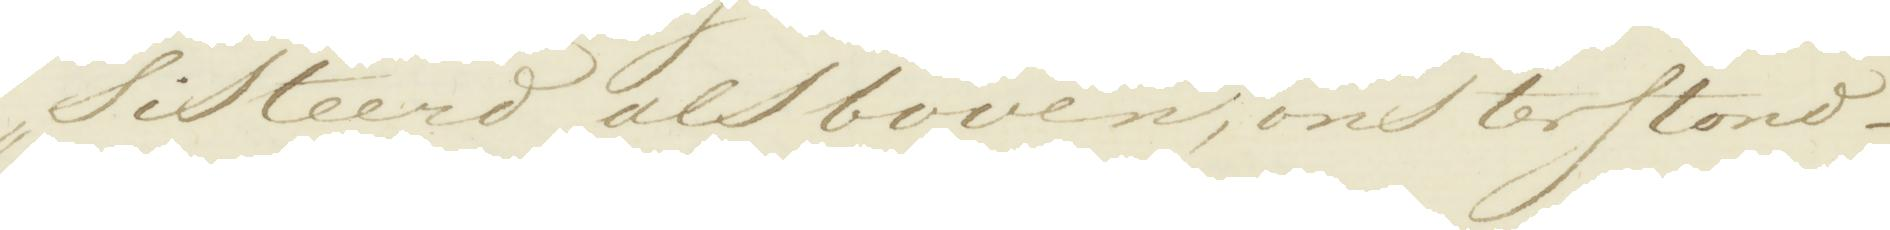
„sisteerd als boven, ons terstond=
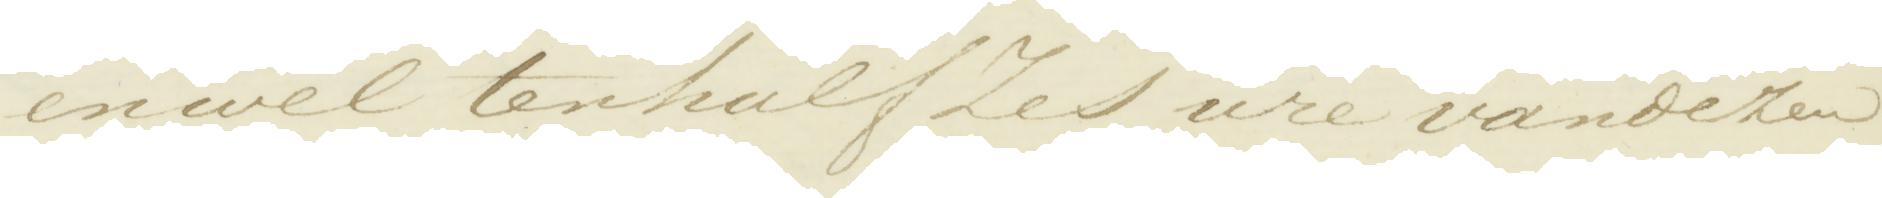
en wel ten half zes ure van dezen
